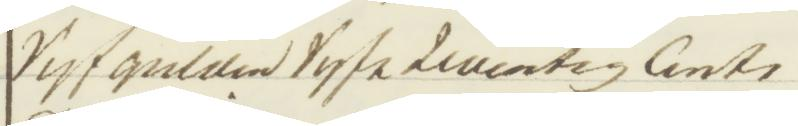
Vyf gulden Vyf en Zeventig Cents
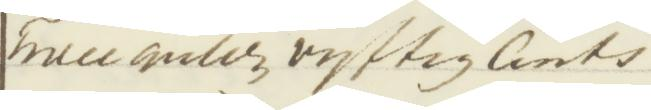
Twee gulden vyftig Cents
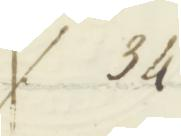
ƒ 34
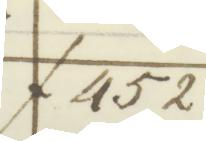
ƒ 452
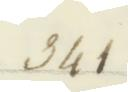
341
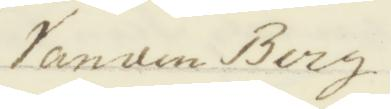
Van den Berg.
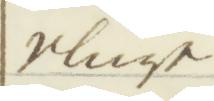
Vlugt
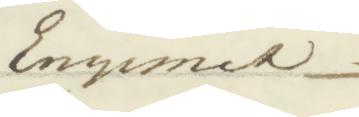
Engsmet
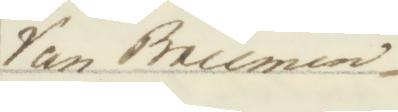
Van Breemen
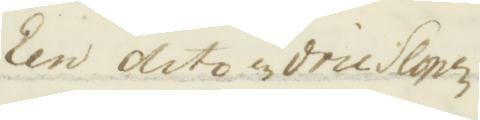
Een dito en drie slopen
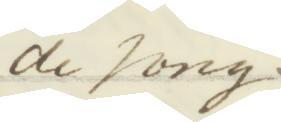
de Jong
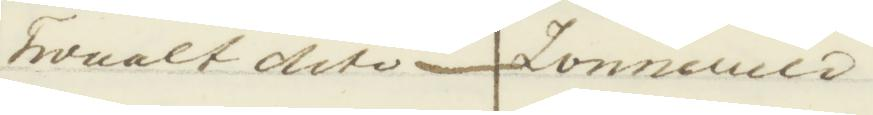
Twaalf dito Zonneveld
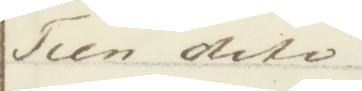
Tien dito
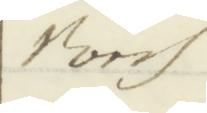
Vorss
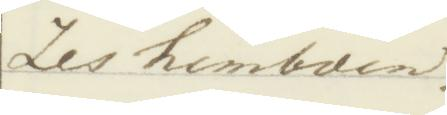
Zes hembden
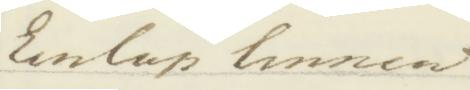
Een lap linnen
